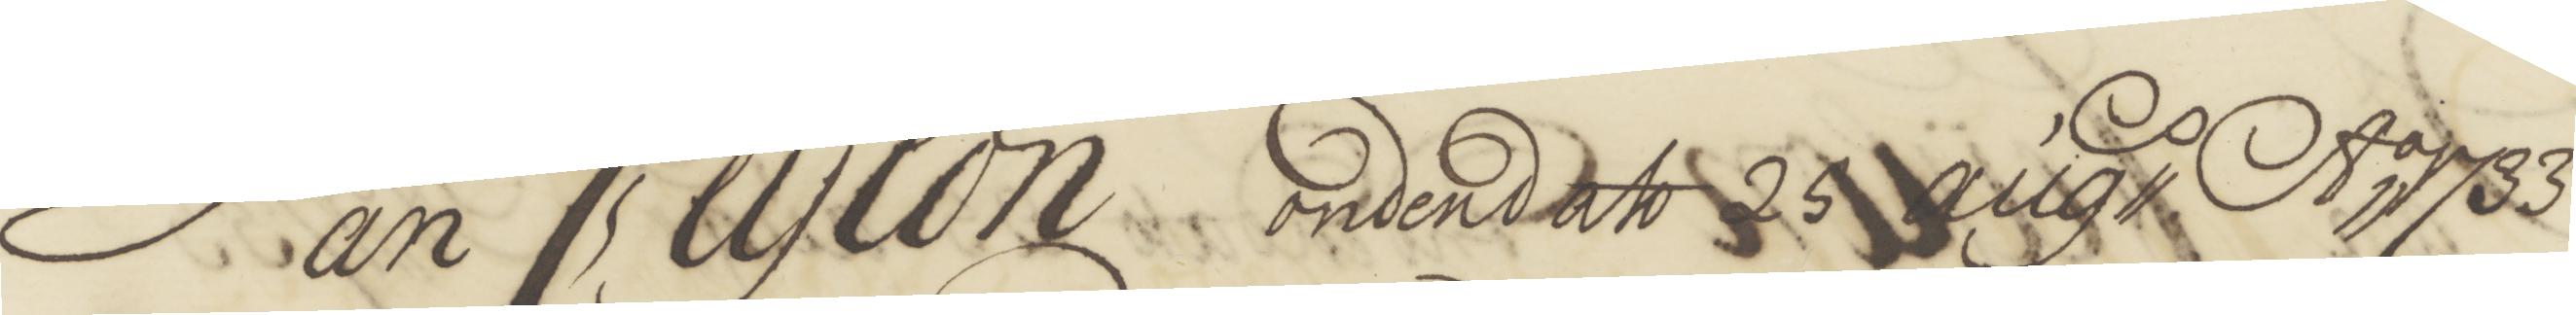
Van Ceijlon onderdato 25 aug„s A„o 1733
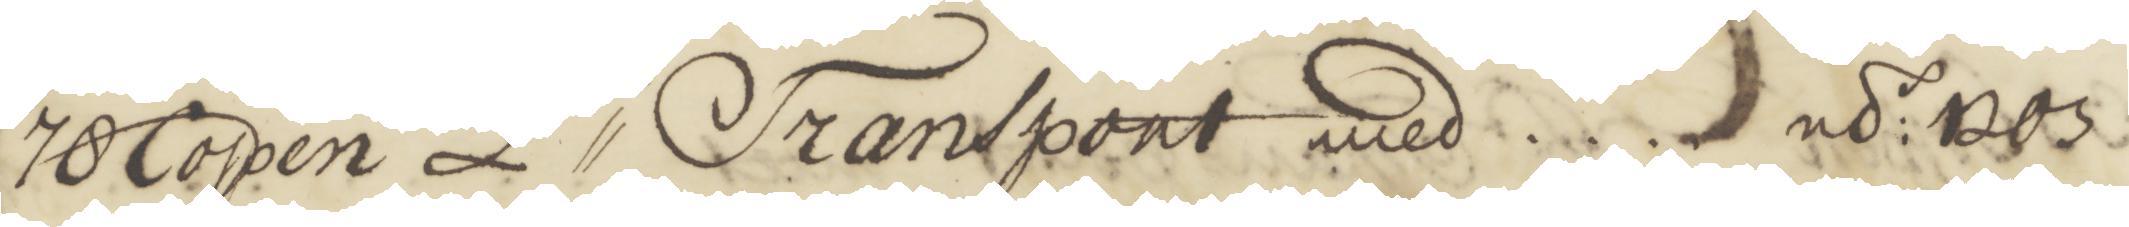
78 Coppen P„r Transport med - - - - rd:s 1203.
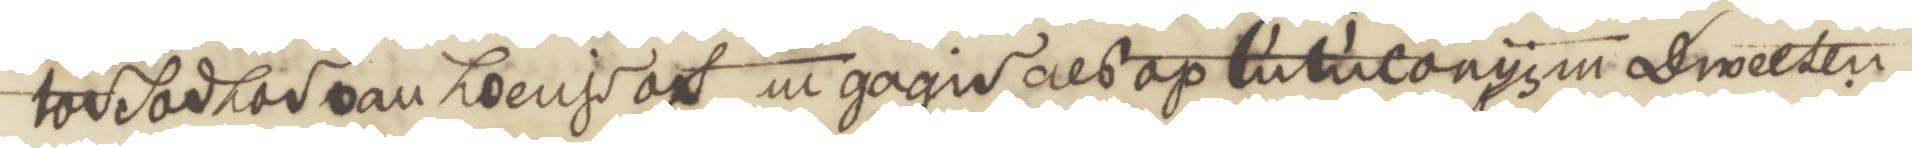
toe soekoe van koenje over 10/m gagie als op tutucorijn 7/m Teweeten
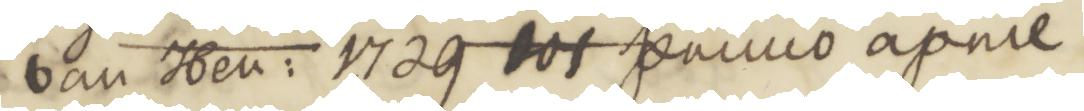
van 7ber: 1729 tot primo april
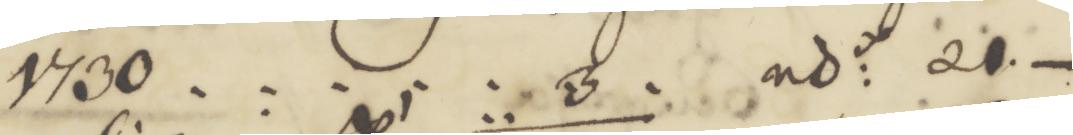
1730 - - - - - 3 - „ rd:s 21. —
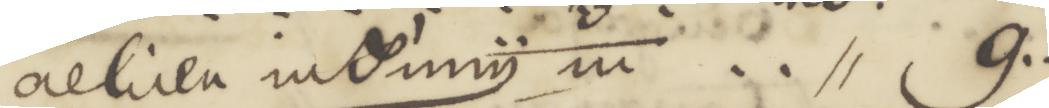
alhier in Iunij 3/m - - „ 9. —
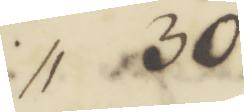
„ 30
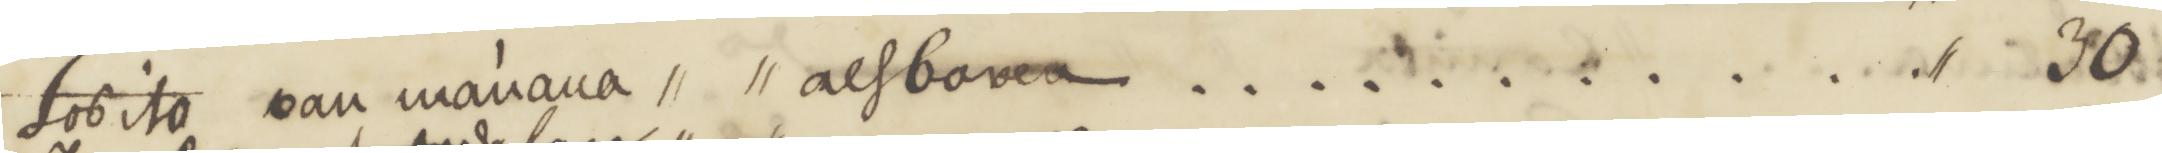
tosito van mauana „ „ alsboven - - - - - - - - - - - „ 30
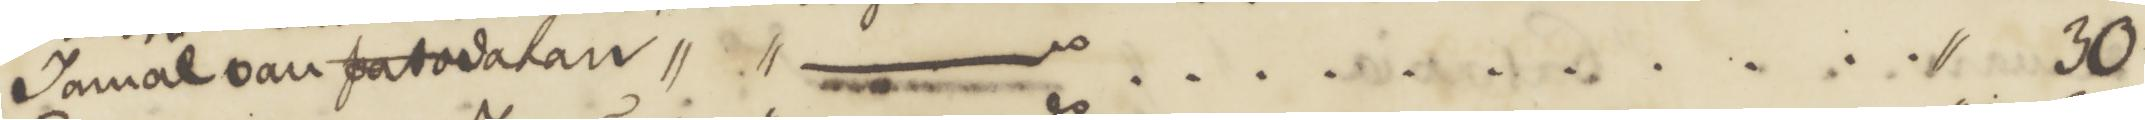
Iamal van patoeakan „ „ do - - - - - - - - - - - „ 30
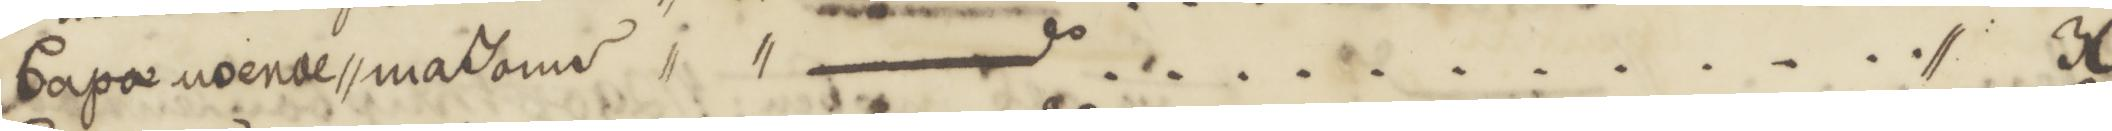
bapa noerde „ ma Iame „ „ do - - - - - - - - - - - - „ 30
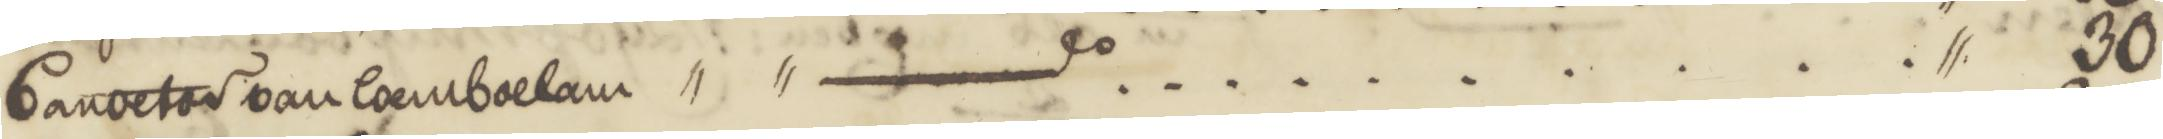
banoetoe van loemboelam „ „ do - - - - - - - - - - „ 30
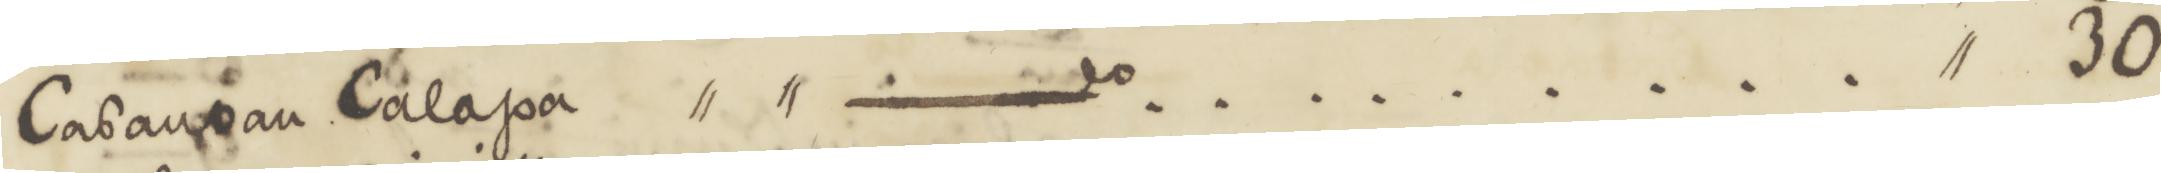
Casan van Calapa „ „ do - - - - - - - - - „ 30
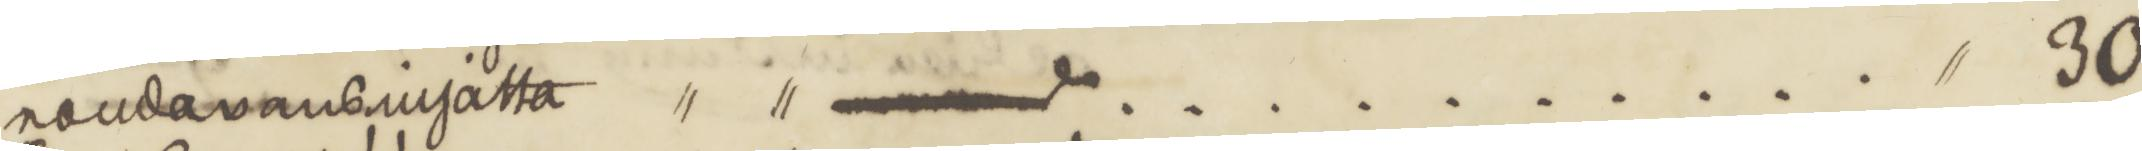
rondavansinjatta „ „ do - - - - - - - - - - „ 30
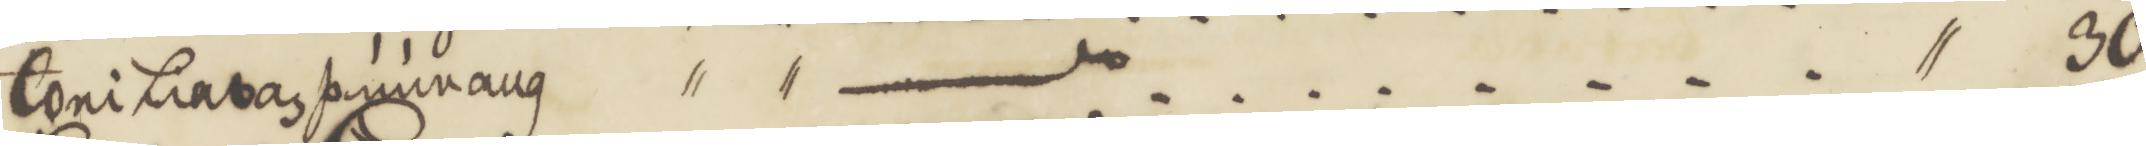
Toni Liavan puurang „ „ do - - - - - - - - „ 30
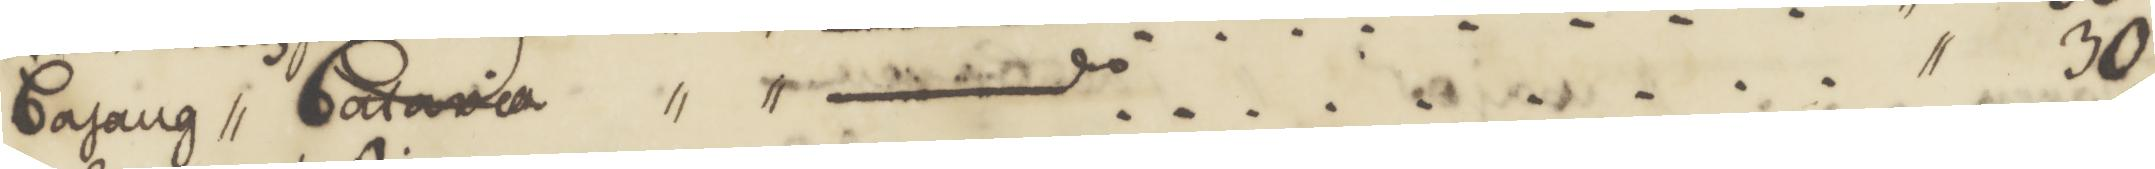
bajang „ batavia „ „ do - - - - - - - - - „ 30
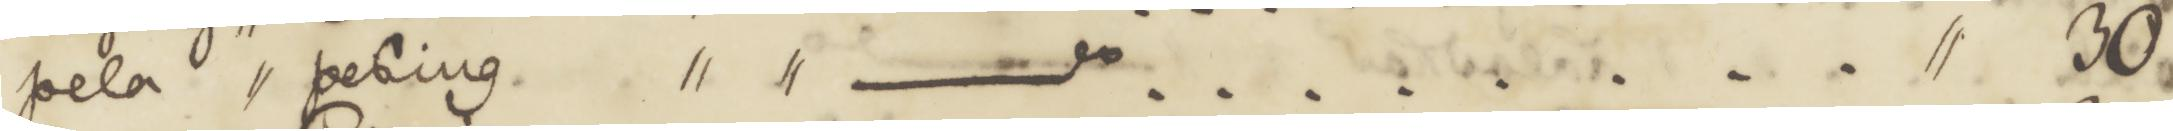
pela „ pesing „ „ do - - - - - - - - „ 30
